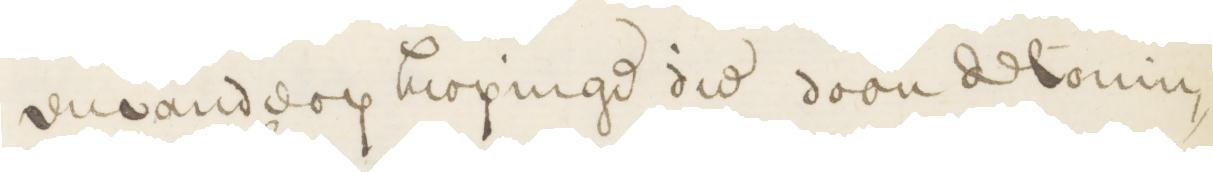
en van de op kopinge die doon deConin„
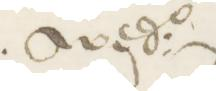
wed.o
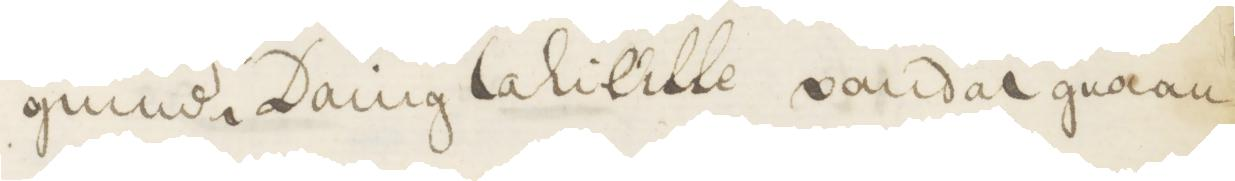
ginne Daing tahilille van dat graan
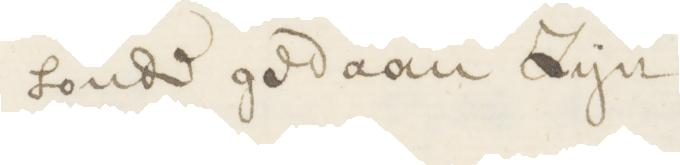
soude gedaan zijn
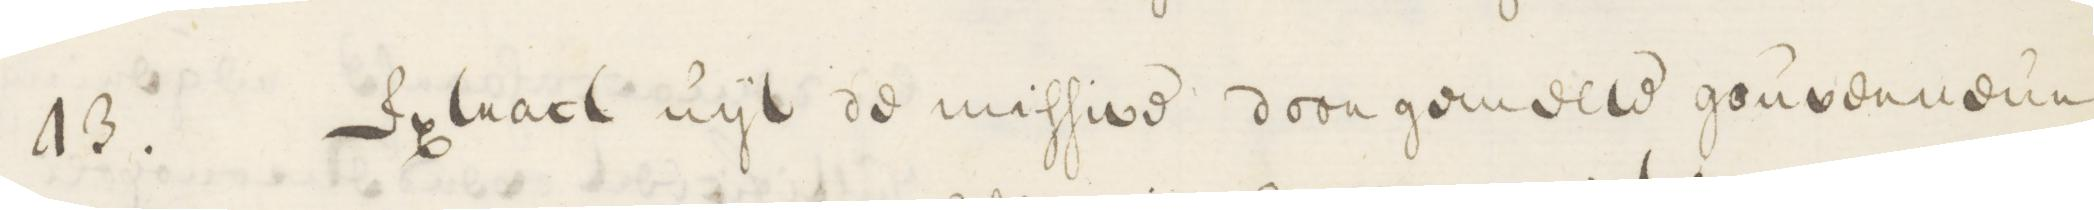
43. Extract uijt de missive door gemelte gouverneur
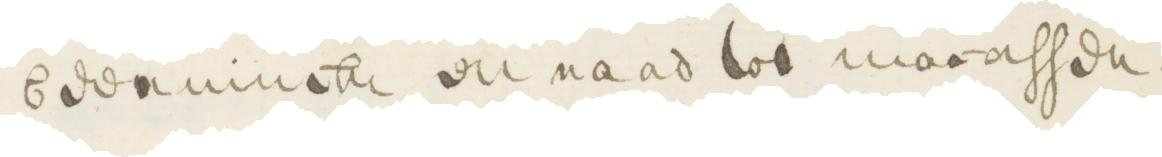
beerninck en raad tot macasser
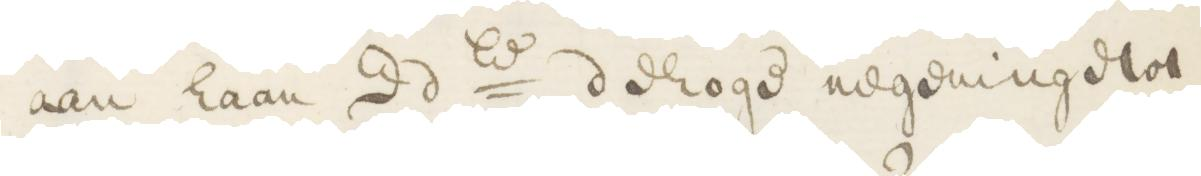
aan haar Ed=le dehoge regeringe tot
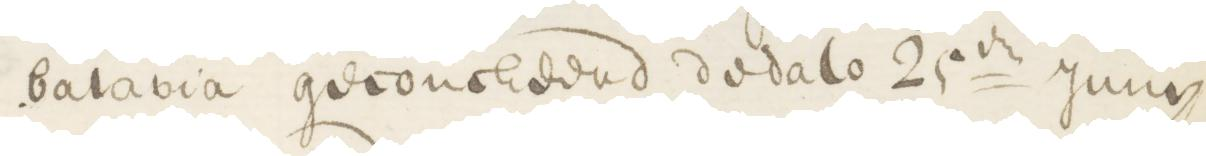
batavia gecoucheerd de dato 25=en junij
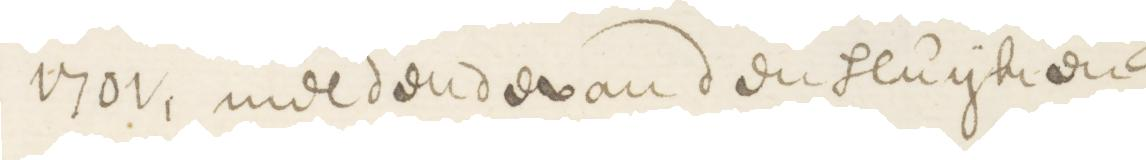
1701, melden devand en fluijken
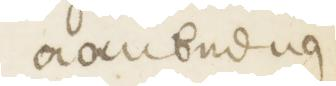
aan breng
